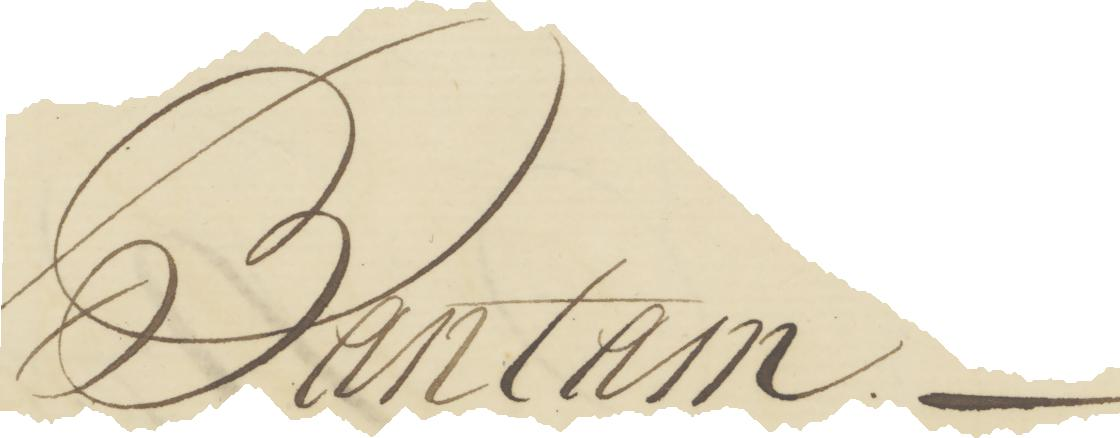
Bantam. —
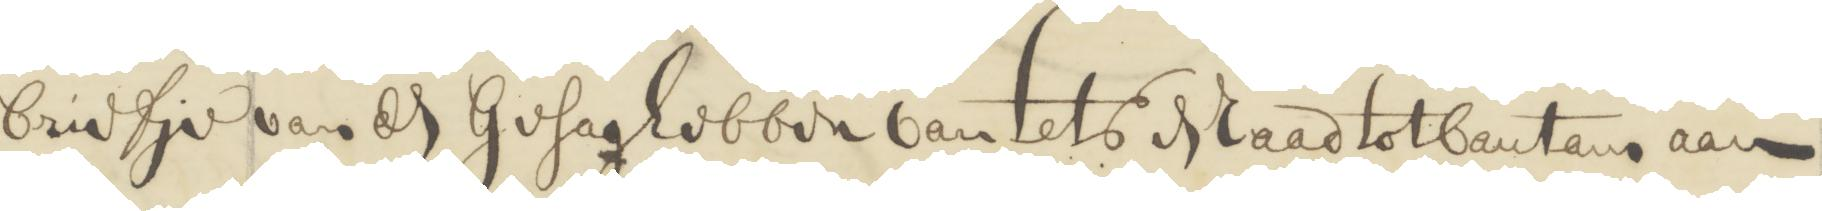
briefje van den Gesaghebber van Tets en Raad tot bantam aan
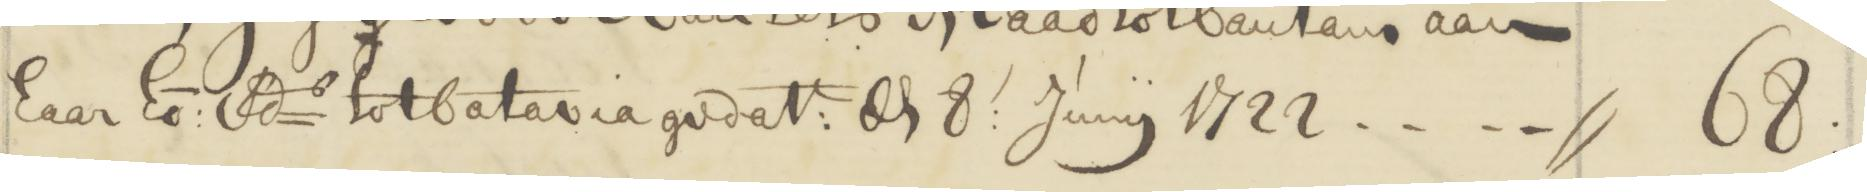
haar Eo: Ed=s tot batavia gedat:t den 8:' Junij 1722 - - - - „ 68:
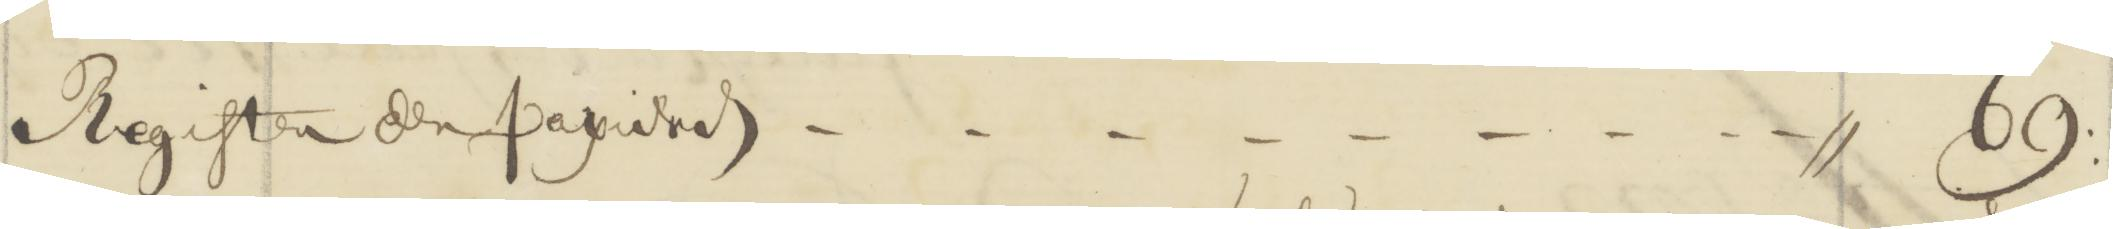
Register der papieren - - - - - - - - - „ 69
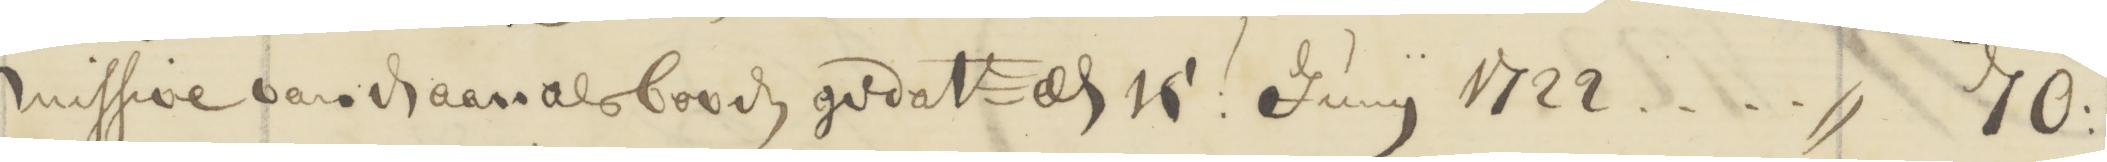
missive van en aan als boven gedat=t den 15:' Junij 1722 - - - - „ 70
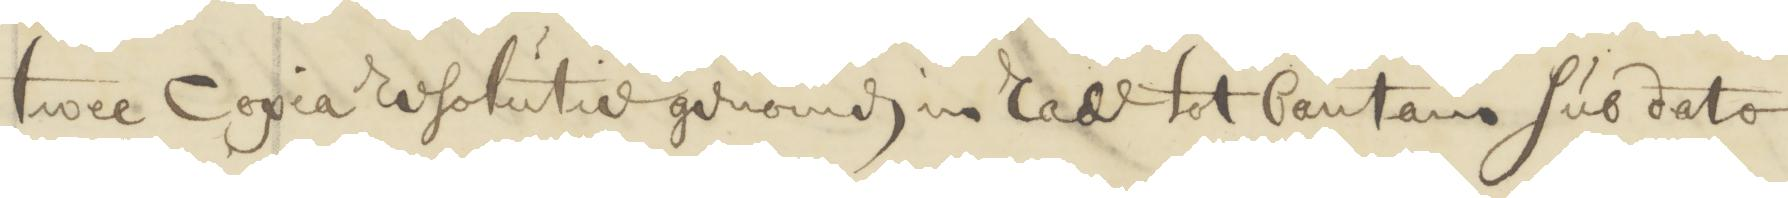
twee Copia resolutie genomen in Rade tot bantam sub dato
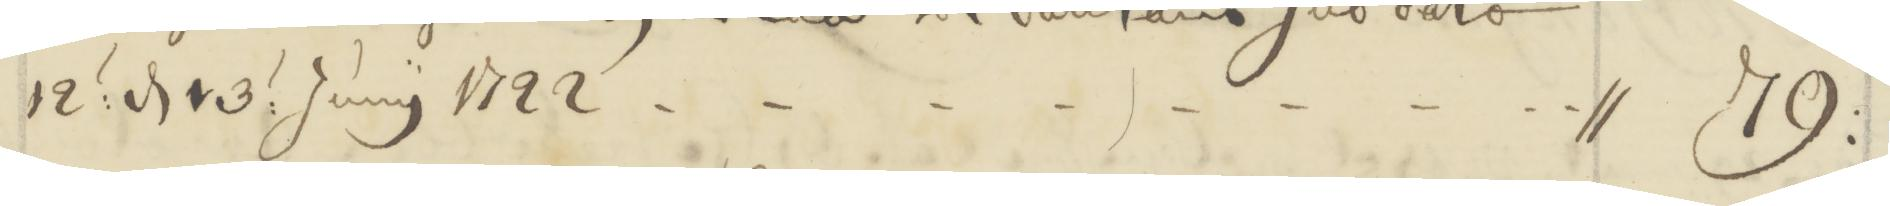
12:' en 13:' Junij 1722 - - - - - - - - - „ 79:
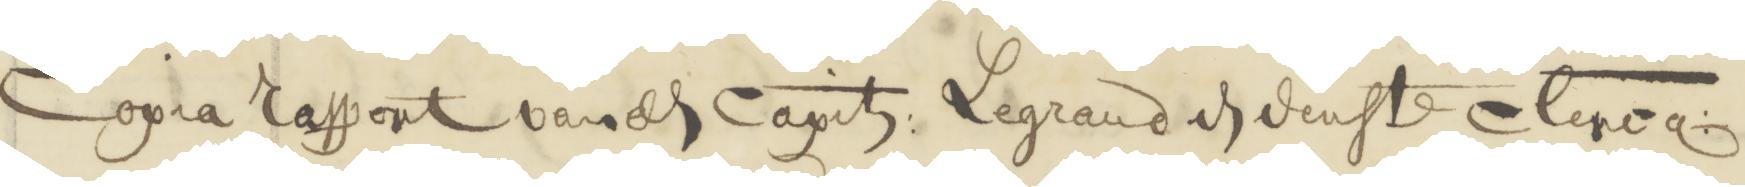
Copia rapport van den Capitn: Legrand en eerste clercq:
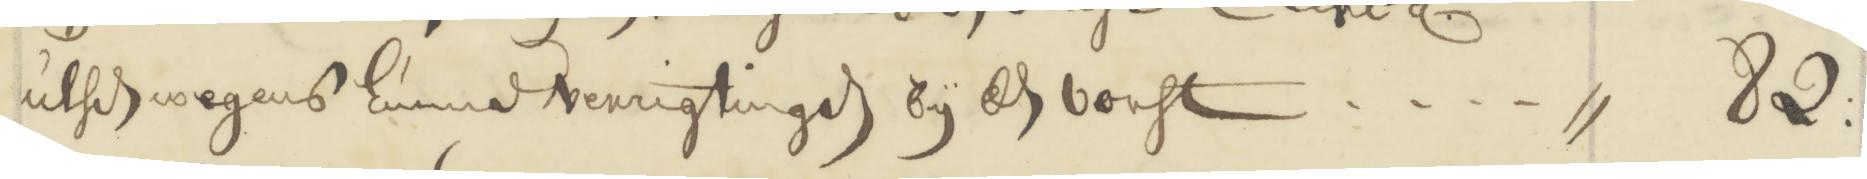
ulsen wegens hunne verrigtingen bij den vorst - - - - „ 82
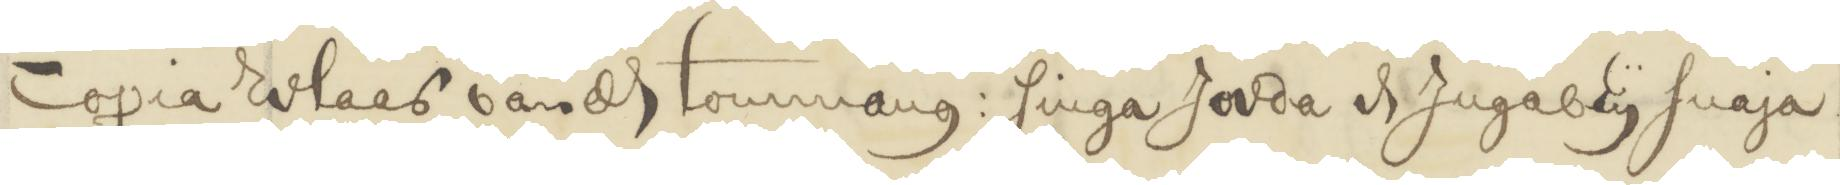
Copia Relaas van den tommang: singa Joeda en Ingabeij snaja
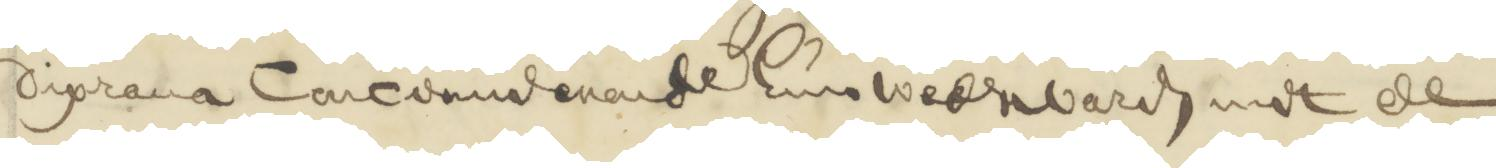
diprana Concerneerende hun wedervaren met de
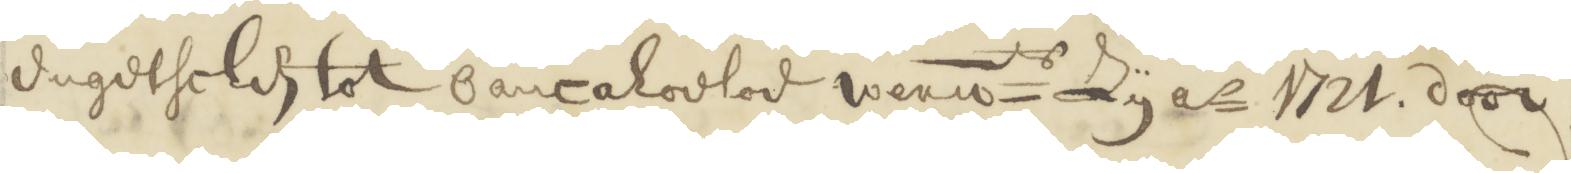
engelschen tot bancahoeloe werw=es zij a=o 1721. door
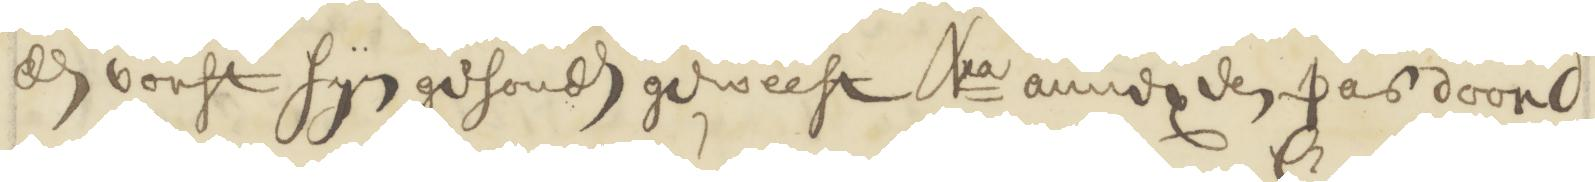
den vorst sijn gesonden geweest X=ra annex een pas door d
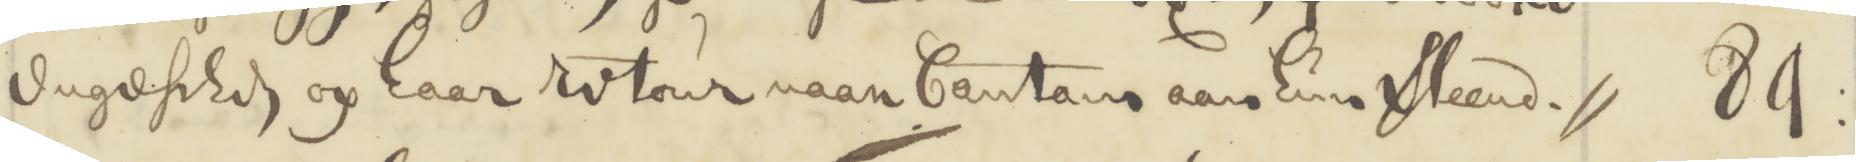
engeschen op haar retour naar bantam aan hun verleend. „ 84:
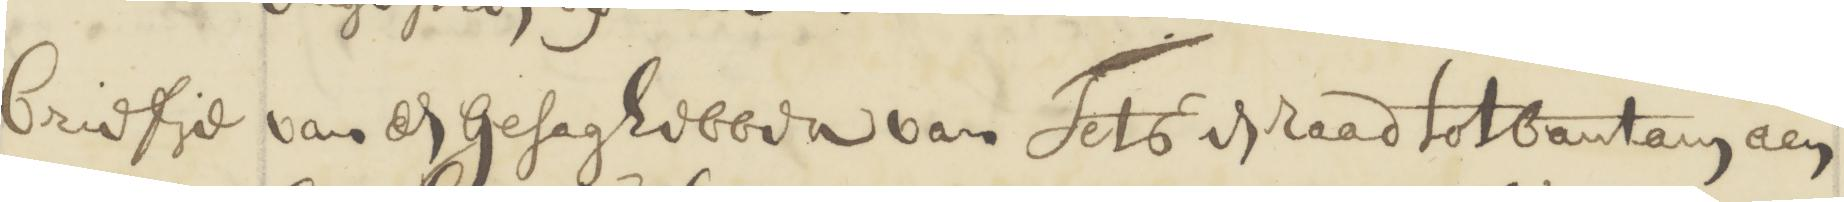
briefje van den Gesaghebber van Tets en raad tot bantam aen
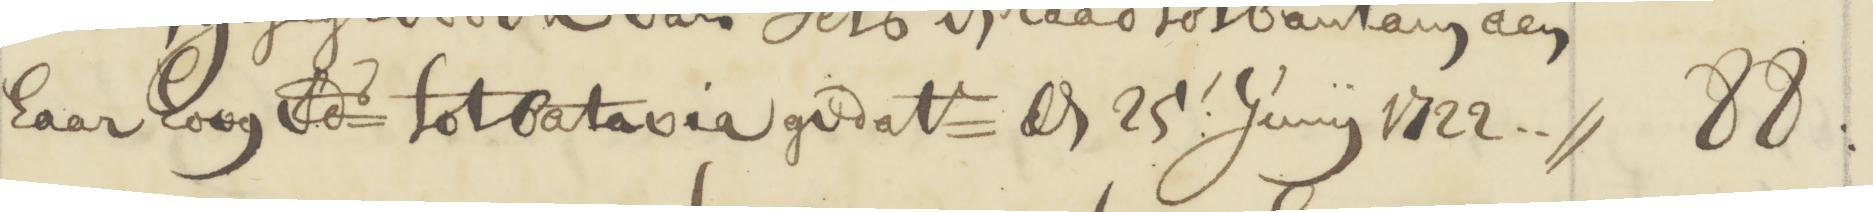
haar hoog Ed=s tot batavia gedat=t den 25:' Junij 1722 - - „ 88:
